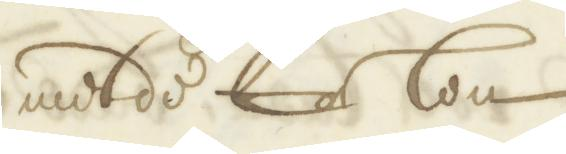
metde costen
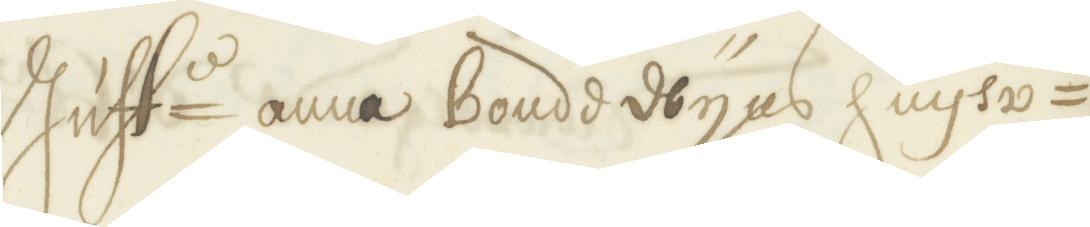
Juff=e anna boudewijns huijsv=r
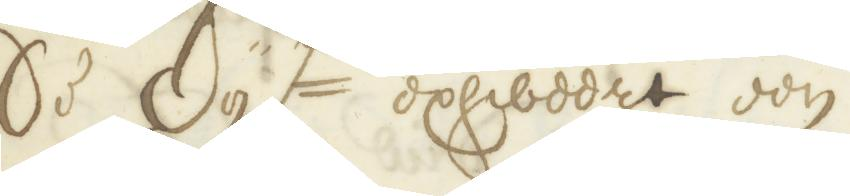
De Eij=rse exhibeert een
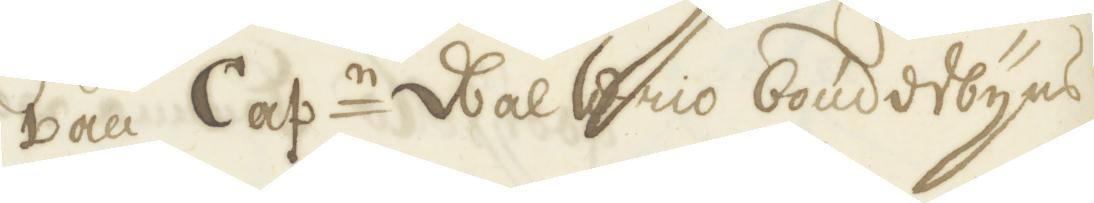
van Cap=n Walterio boudewijns
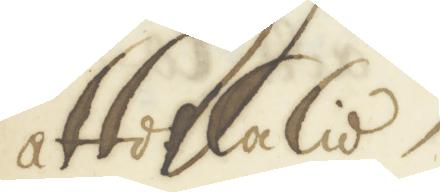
attestatie,
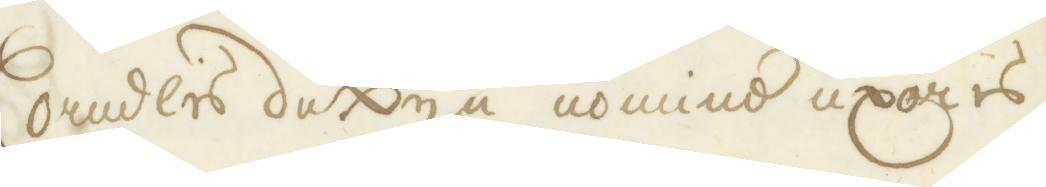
Cornelis dupijn nomine uxoris
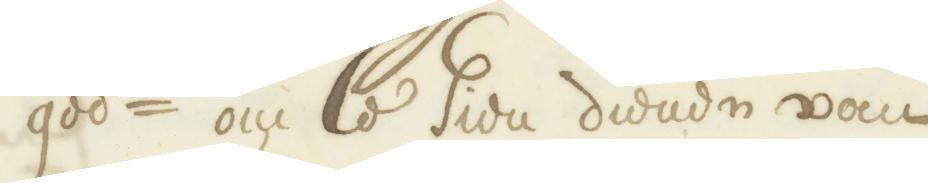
ged=e om te sien dienen van
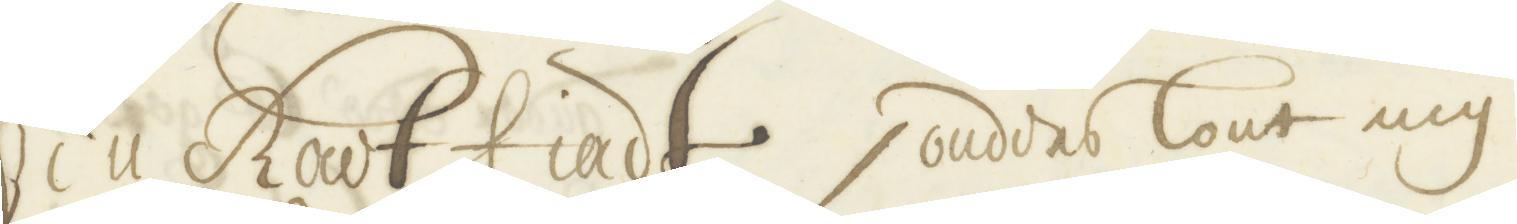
Den Raet Fiadt /onderstont mij
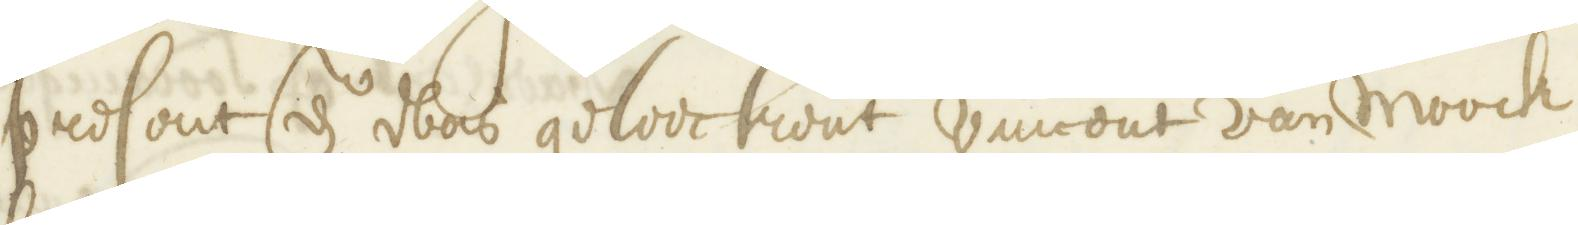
present (en was geteeckent vincent van Moock
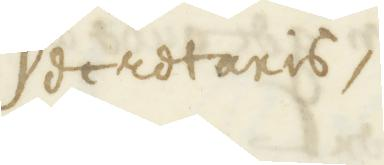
Secretaris/
